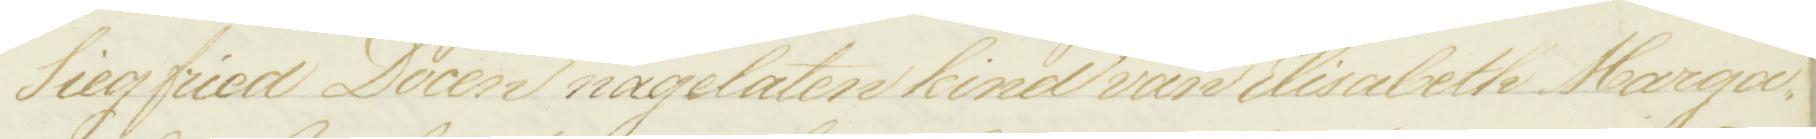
Siegfried Docen nagelaten kind van Elisabeth Marga„
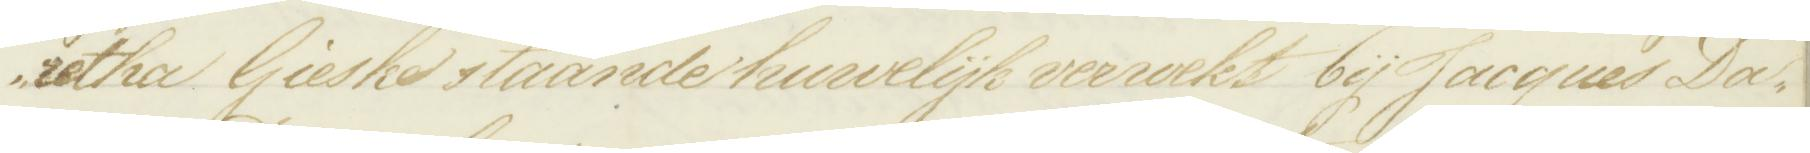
„retha Gieske staande huwelijk verwekt bij Jacques Da„
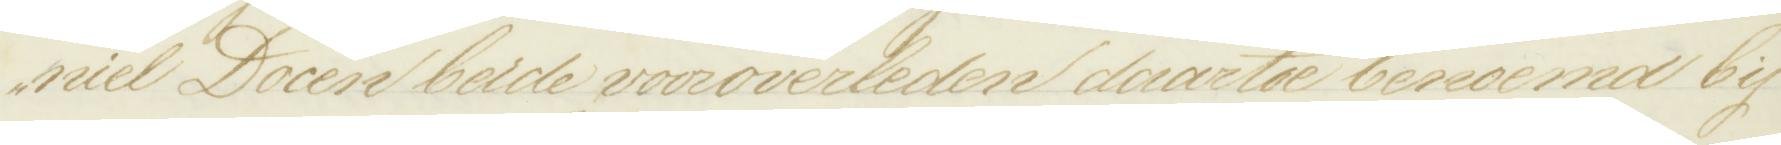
„niel Docen beide vooroverleden daartoe benoemd bij
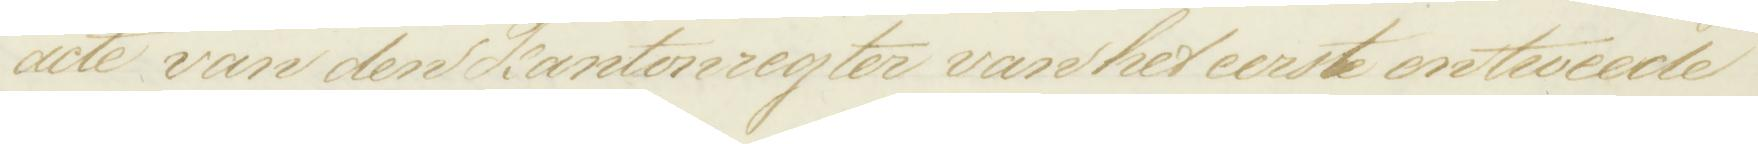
acte van den Kantonregter van het eerste en tweede
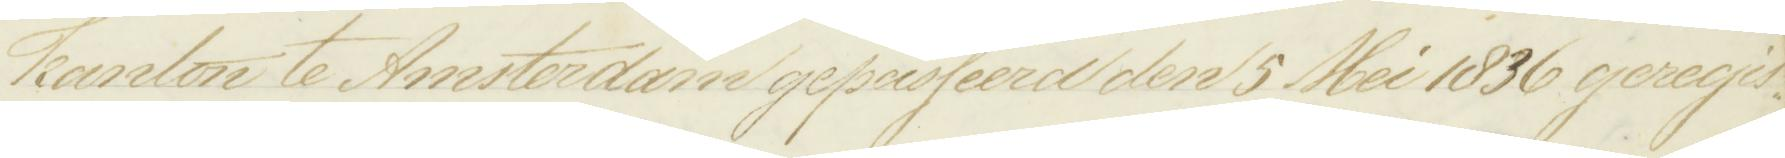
Kanton te Amsterdam gepasseerd den 5 Mei 1836 geregis„
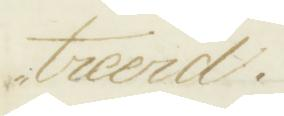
„treerd.
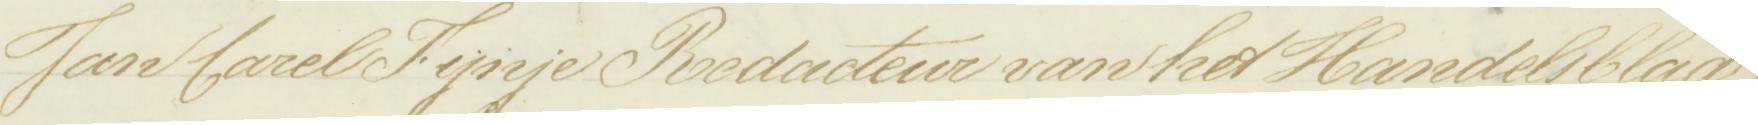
Jan Carel Fijnje Redacteur van het Handelsblad
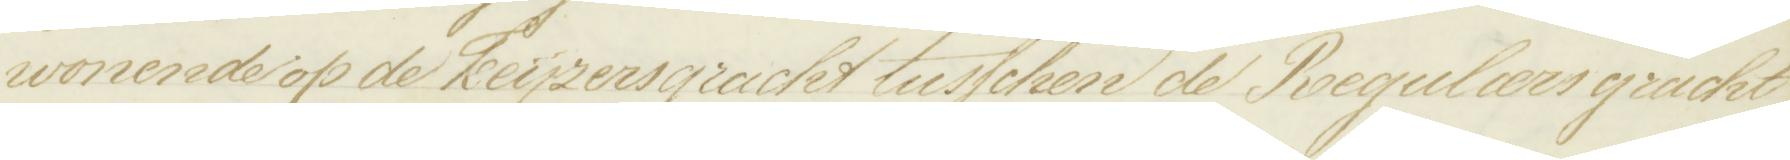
wonende op de Keijzersgracht tusschen de Reguliersgracht
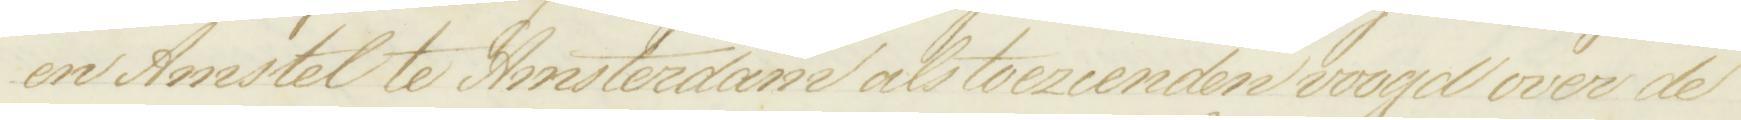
en Amstel te Amsterdam als toezienden voogd over de
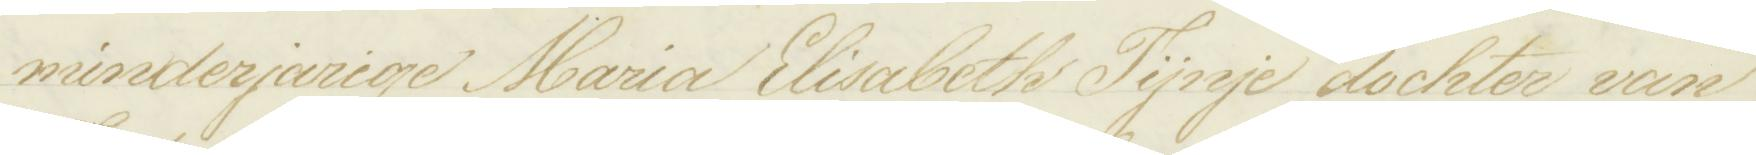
minderjarige Maria Elisabeth Fijnje dochter van
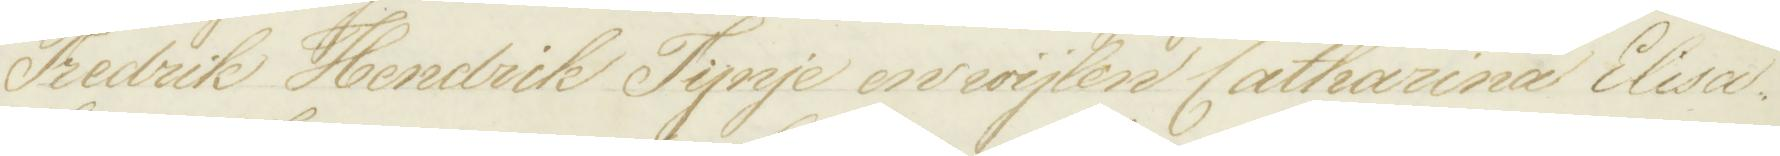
Fredrik Hendrik Fijnje en wijlen Catharina Elisa„
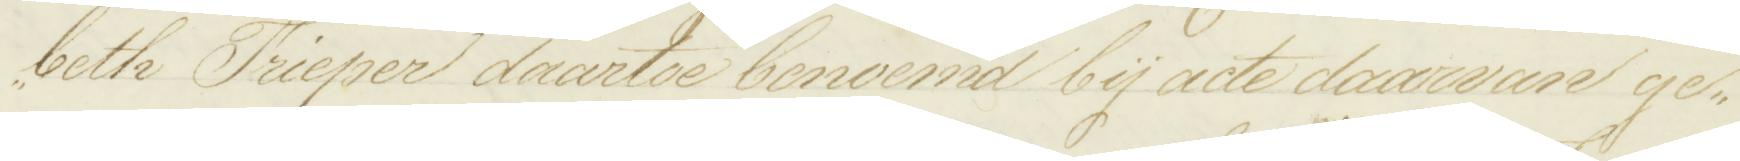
boethe Frieper daartoe benoemd bij acte daarvan ge„
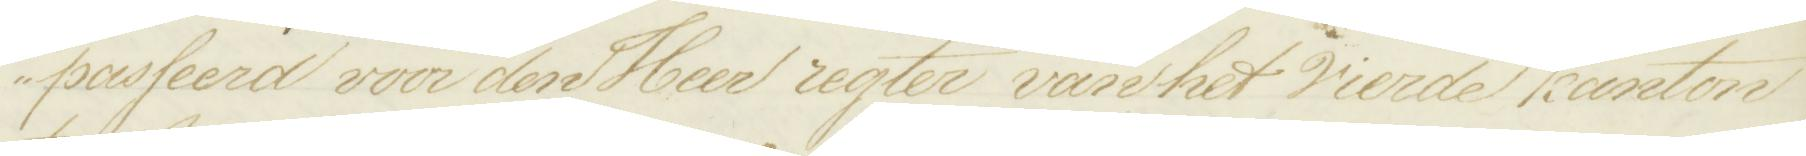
„passeerd voor den Heer regter van het Vierde kanton
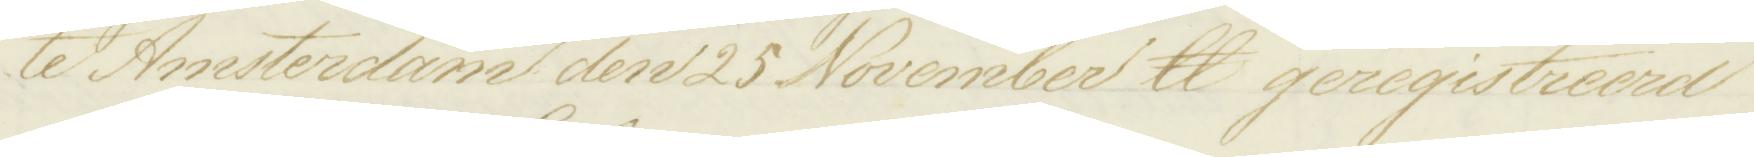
te Amsterdam den 25 November te geregistreerd
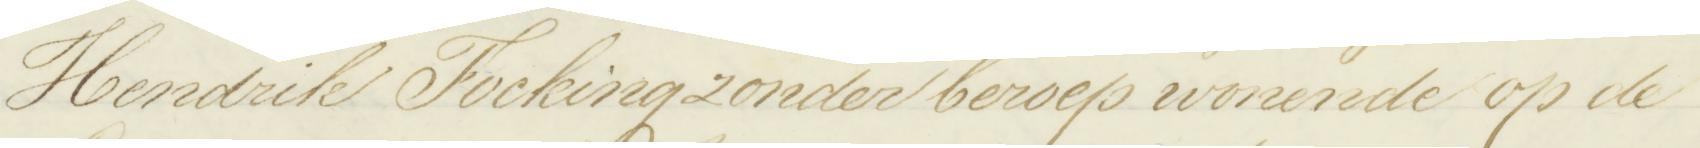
Hendrik Focking zonder beroep wonende op de
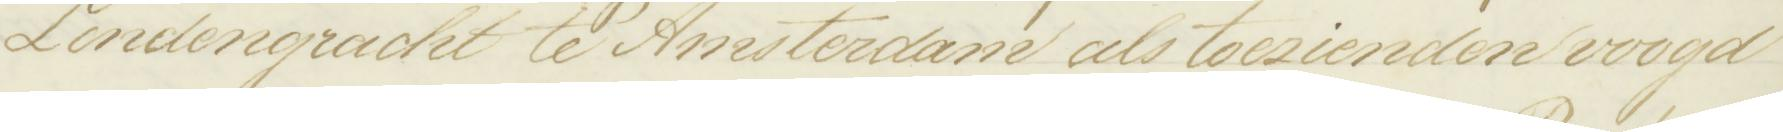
Lindengracht te Amsterdam als toezienden voogd
